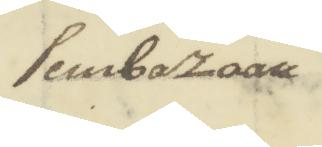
Sembazaar
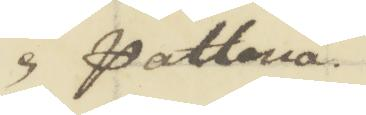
en pattena.
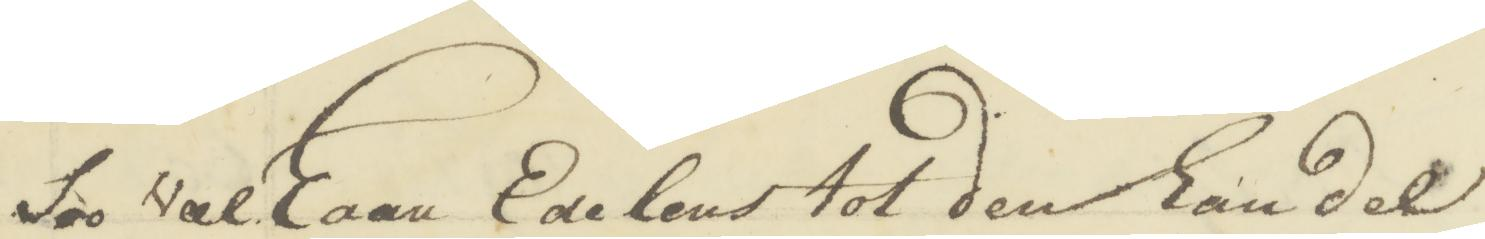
Soo veel haar Edelens tot den handel
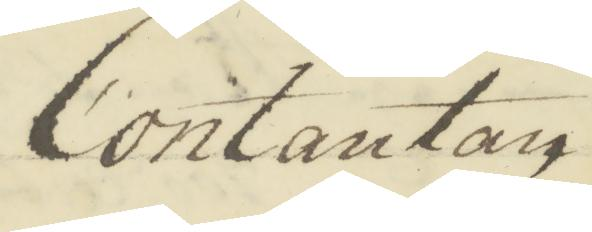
Contantan
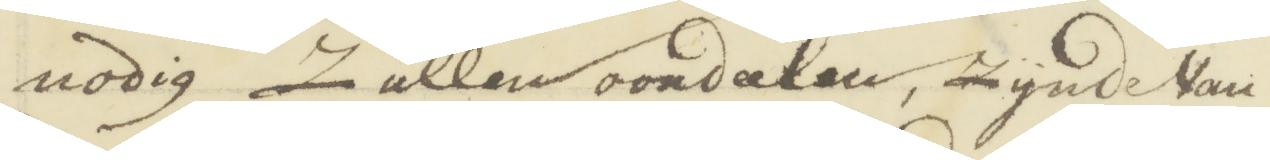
nodig Zullen oordeelen, Zijnde Van
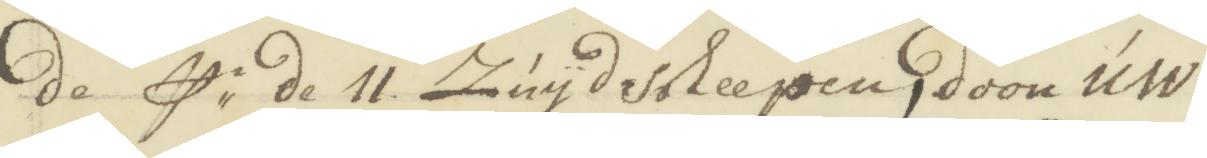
de p„r de 11. Zuijdscheepen, door uw
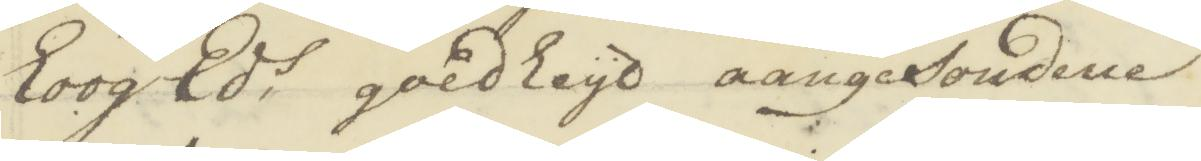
hoog Ed:s goedheijd aangesondene
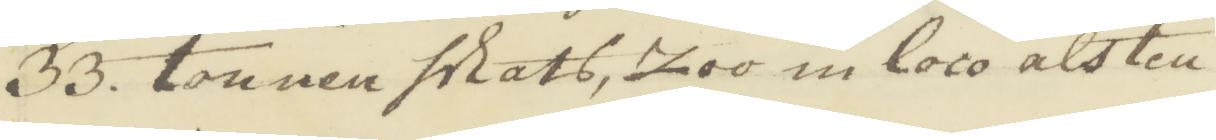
33. tonnen schats, Zoo in loco als ten
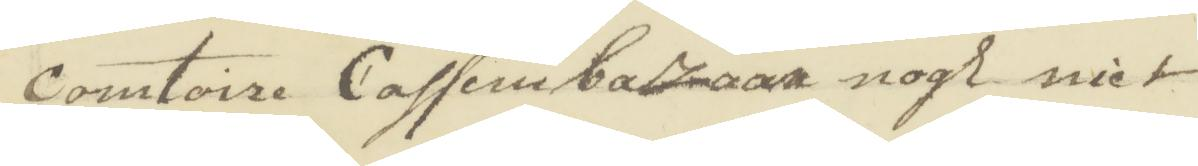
comtoire Cassembasaar nogh niet
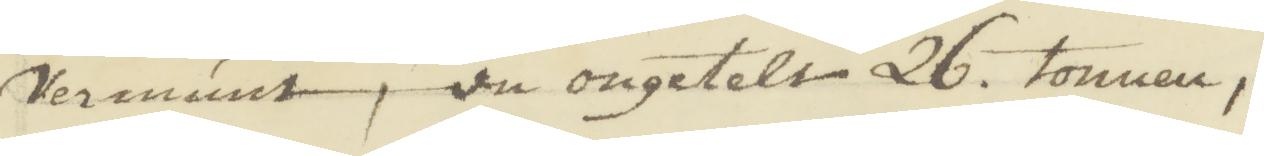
vermunt, en ongetelt 26. tonnen,
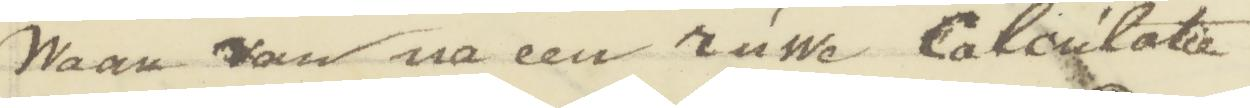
waar van na een ruwe Calculatie
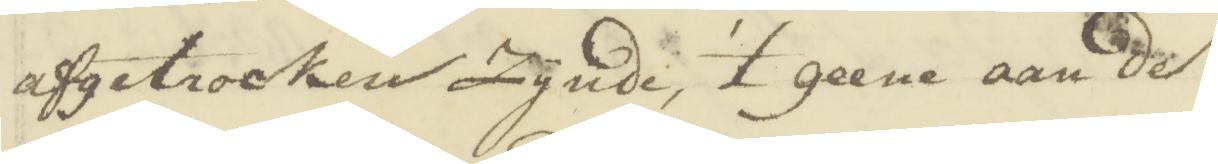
afgetrocken Zijnde, ’t geene aan de
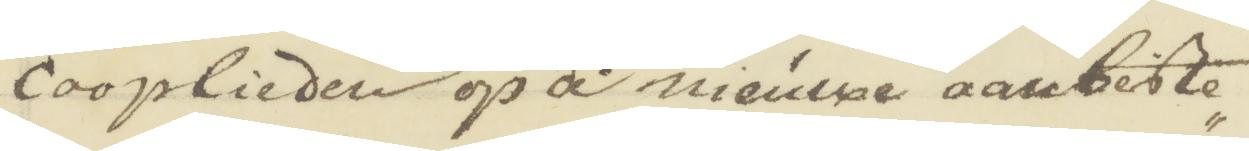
cooplieden op de nieuwe aanbeste„
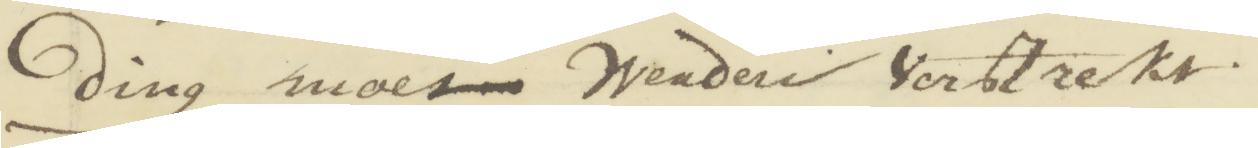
ding moet werden verstrekt.
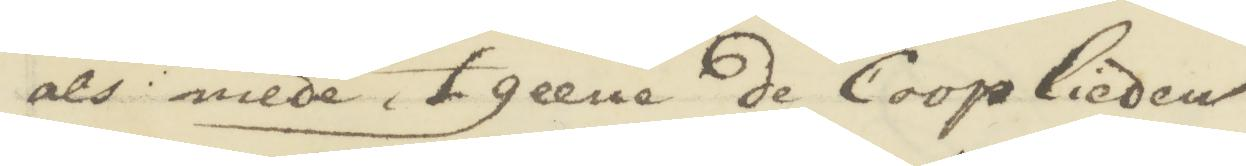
als: mede ’t geene de Cooplieden
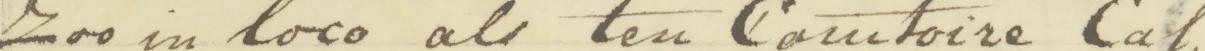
Zoo in loco als ten Comtoire Cas
